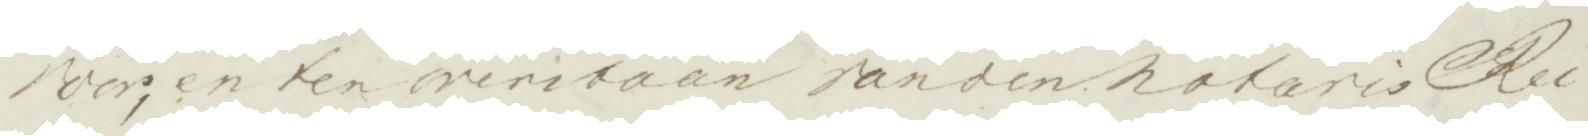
voor, en ten overstaan van den notaris Rei
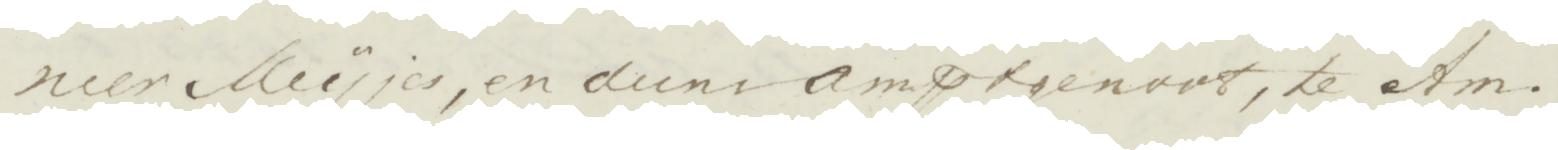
nier Meijjes, en diens amptgenoot, te Am.
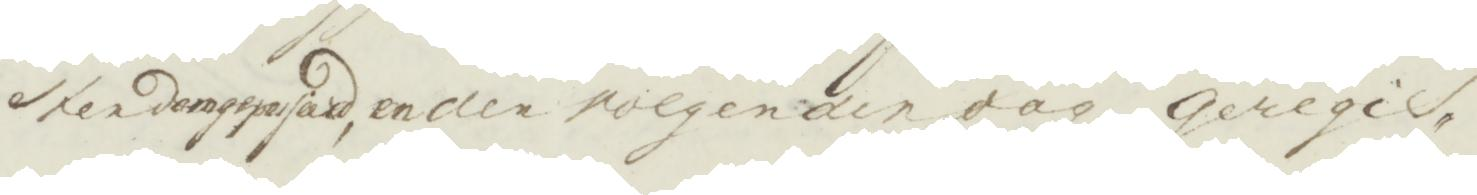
sterdam gepasseerd, en den volgenden dag geregis„
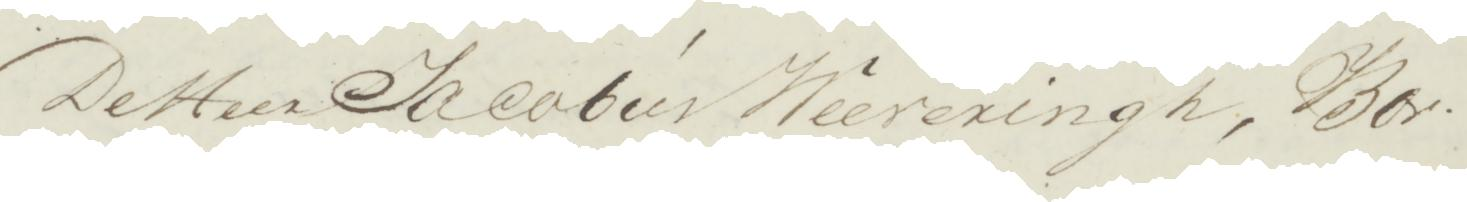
De Heer Jacobus Weeveringh, Bor„
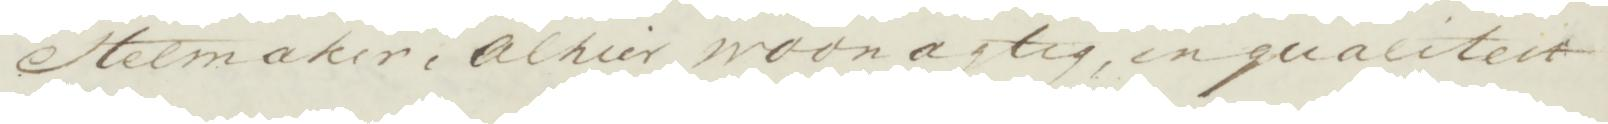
stelmaker, alhier woonagtig, in qualiteit
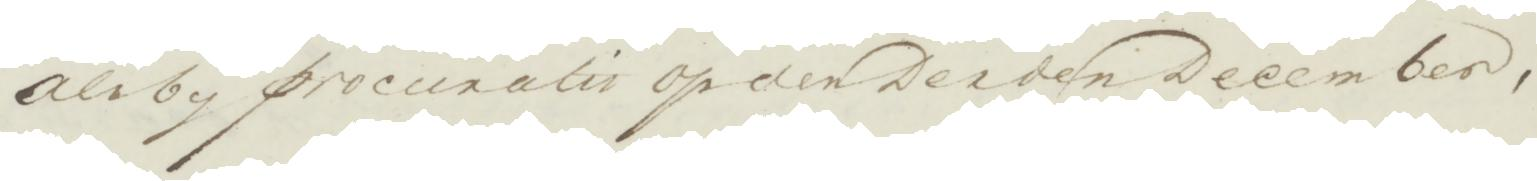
als bij procuratie op den Derden December,
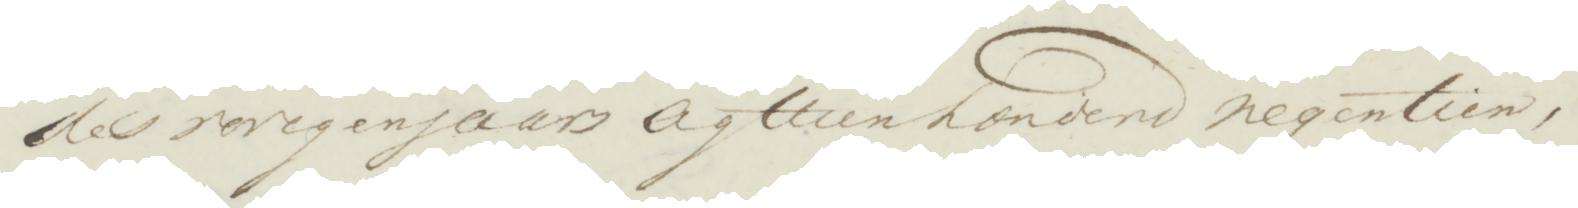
des vorigen jaars agttienhonderd negentien,
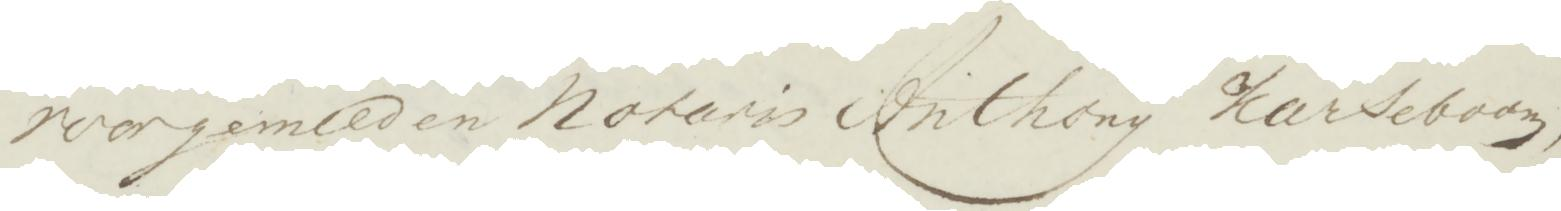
voorgemelden Notaris Anthonij Karseboom,
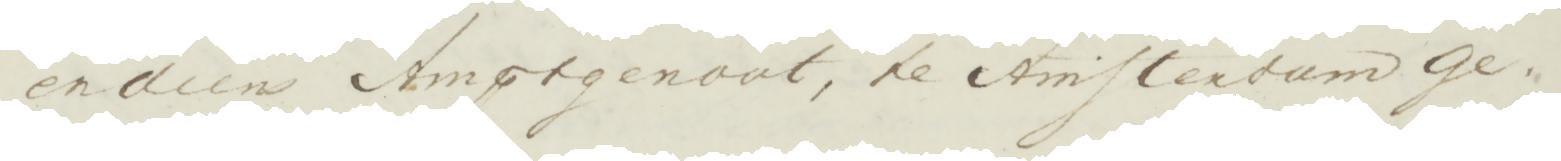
en diens Amptgenoot, te Amsterdam ge„
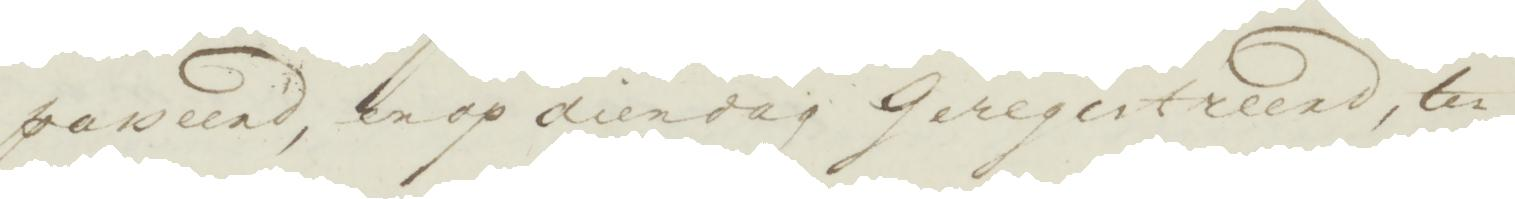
passeerd, en op dien dag Geregistreerd, ter
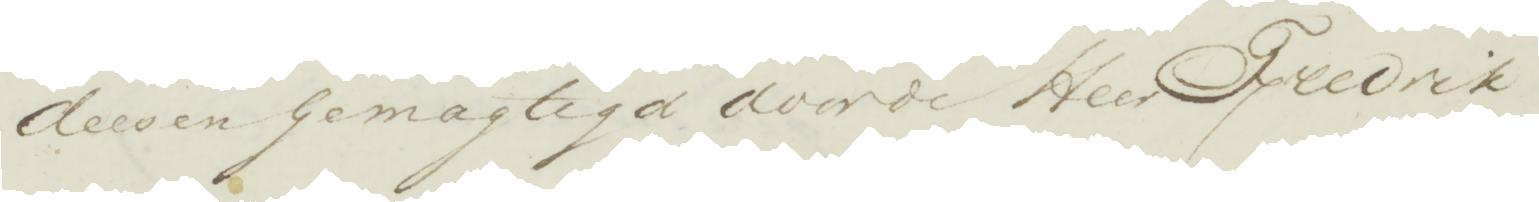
deesen gemagtigd door de Heer Fredrik
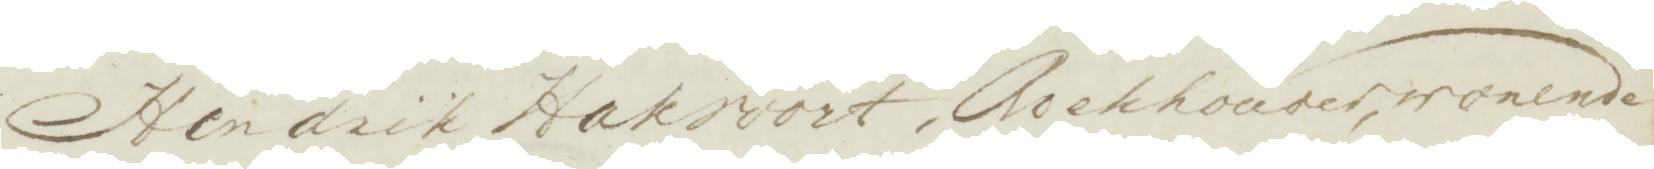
Hendrik Hakvoort, Boekhouder, wonende
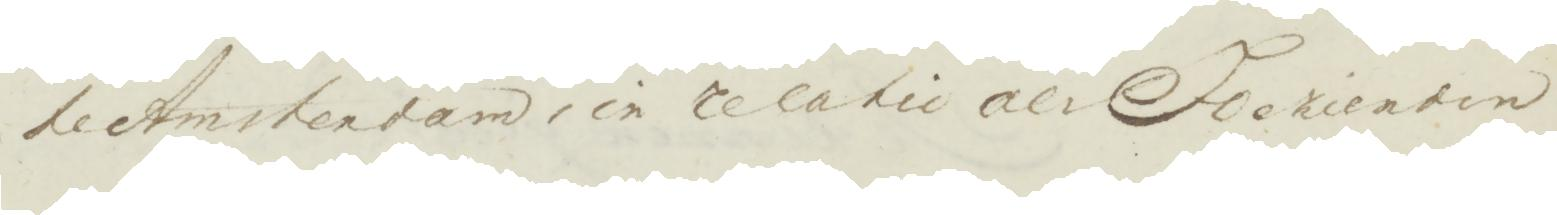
te Amsterdam, in relatie als Toezienden
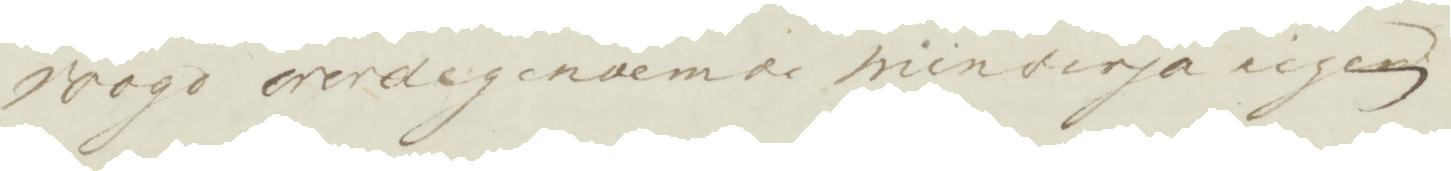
voogd over de genoemde minderjarigen
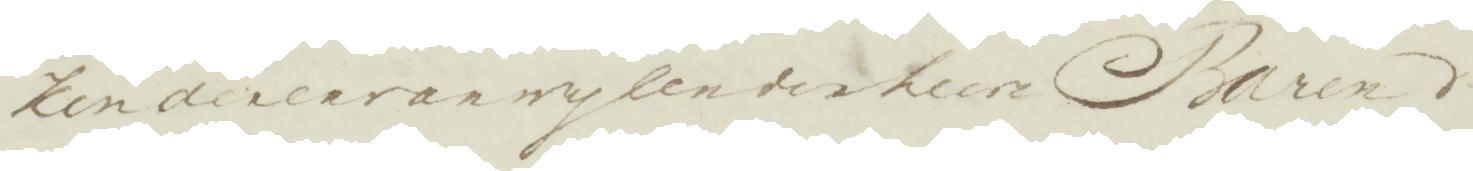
Kinderen van wijlen den heere Barend
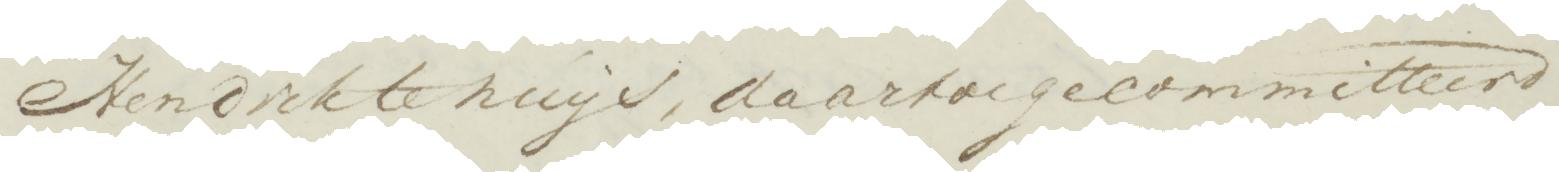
Hendrik te nuijs, daartoe gecommitteerd
